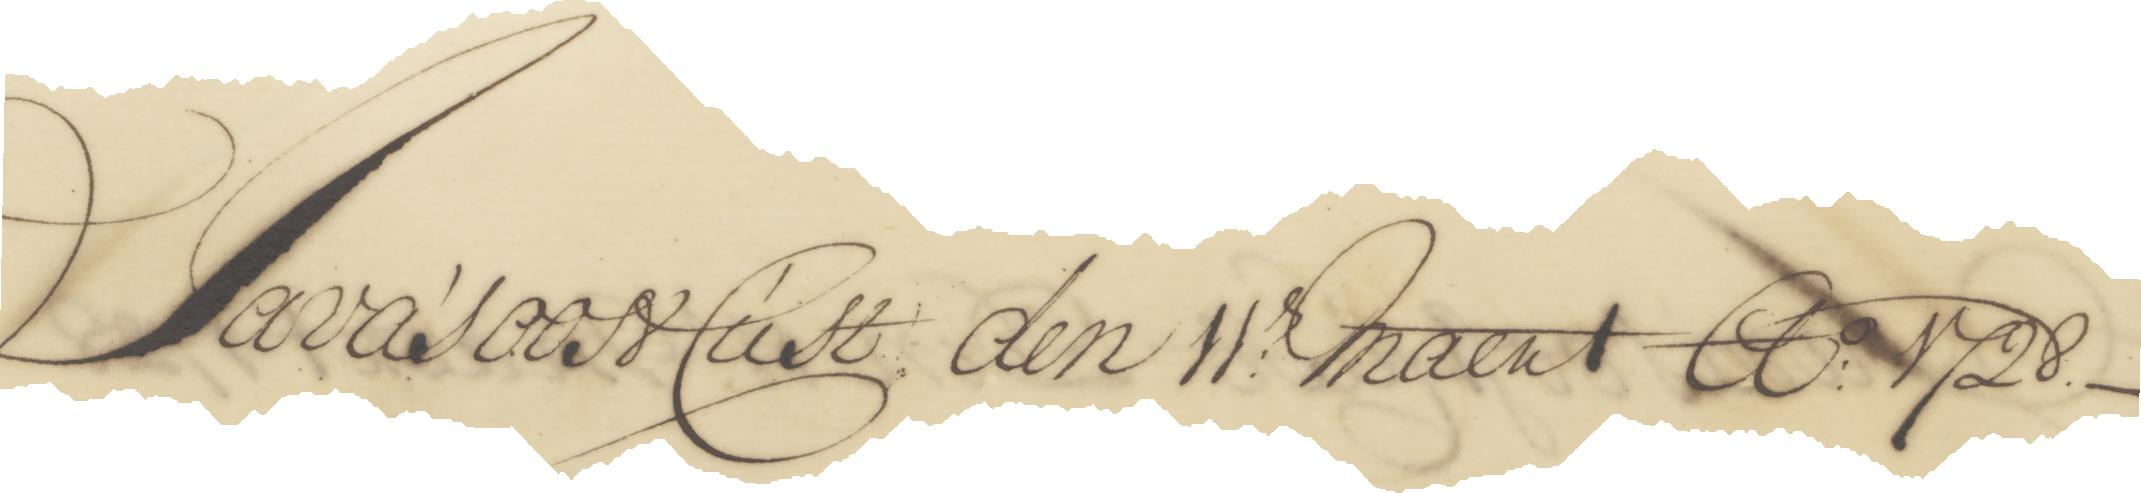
Java's oost Cust den 11:en maert A:o 1728. -
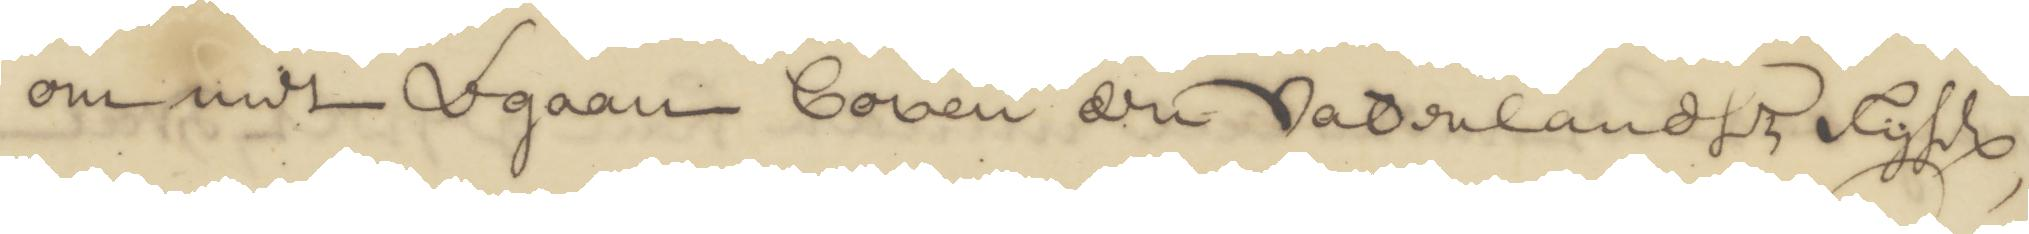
om niet tegaan boven den Vaderlandsen Eijsch
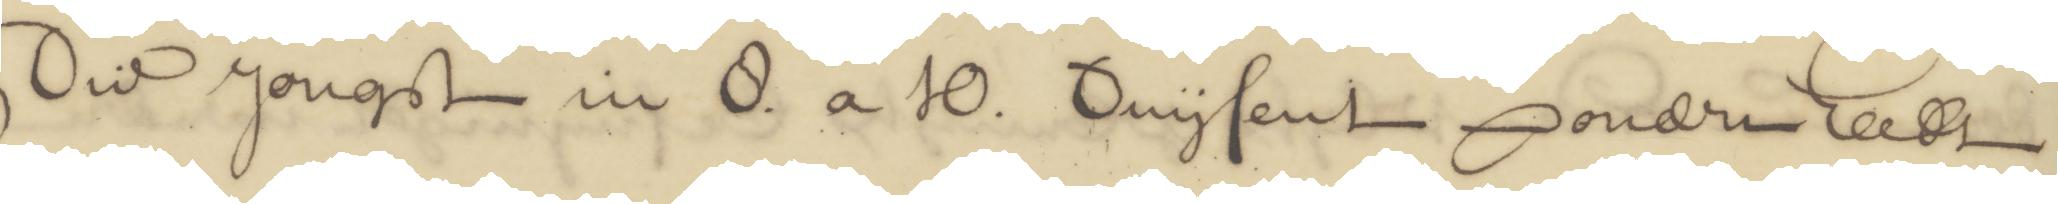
die jongst in 8. a 10. Duijsent ponden heeft
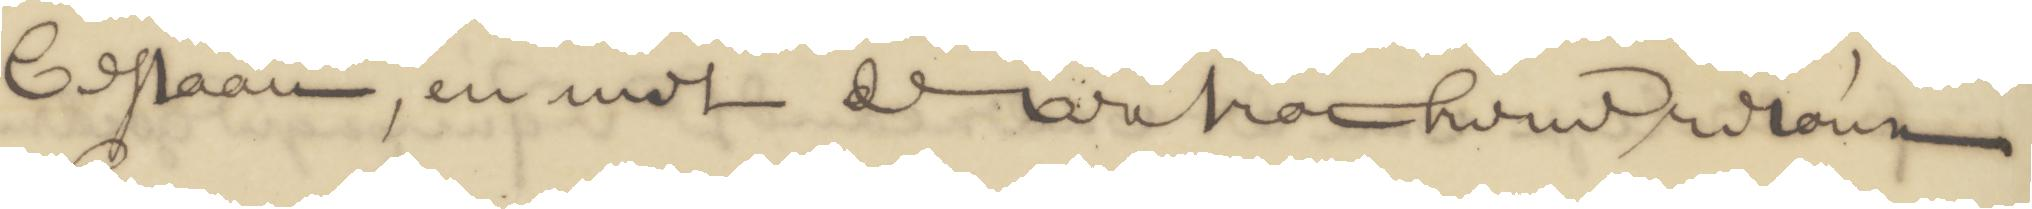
bestaan, en met de vertrockene retour
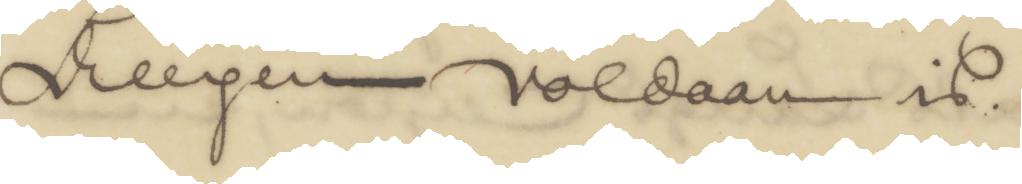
scheepen voldaan is.
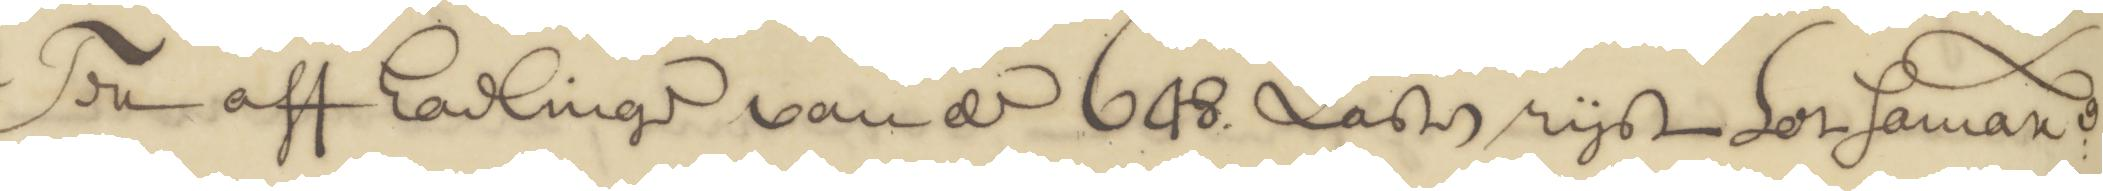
Ter aff haelinge van de 648. lasten rijst tot samar:e
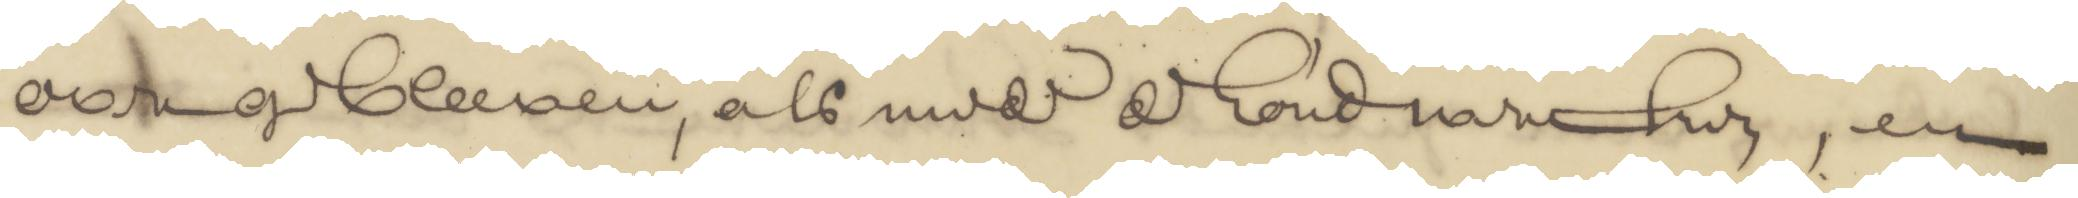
overgebleeven, als mede de houdwercken, en
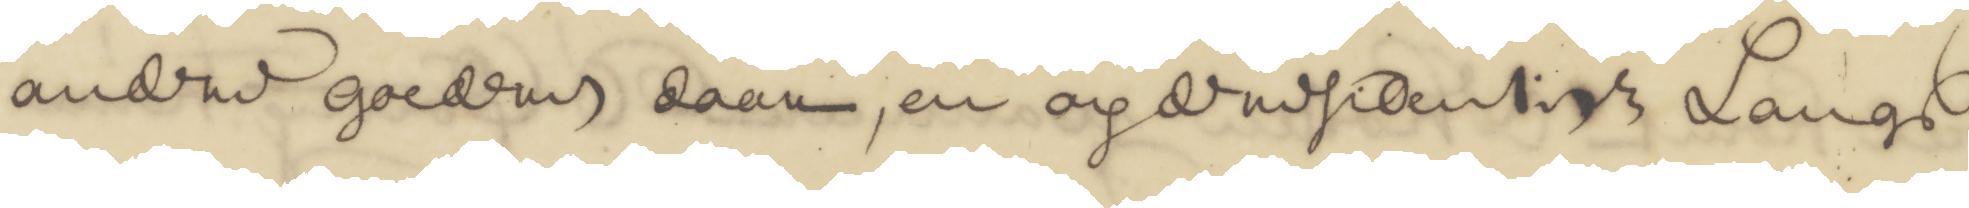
andere goederen daar, en op de residentien langs
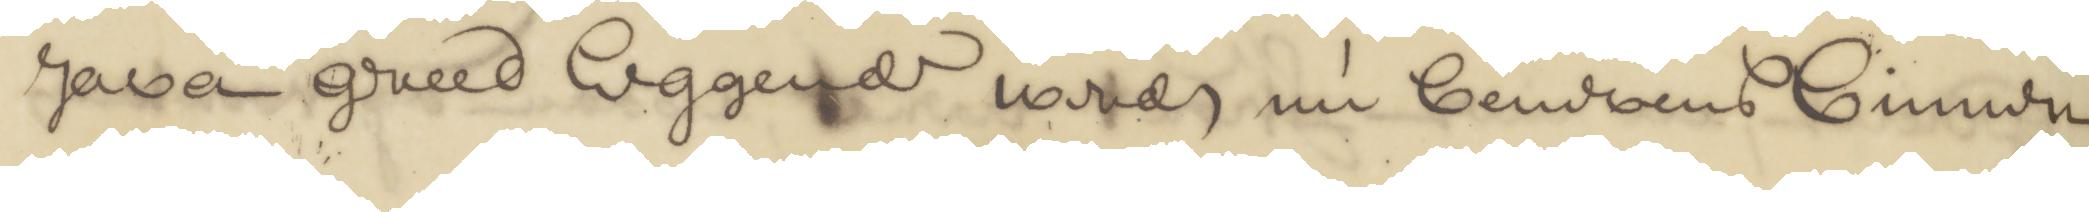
Java gereed leggende werden nu benevens binnen
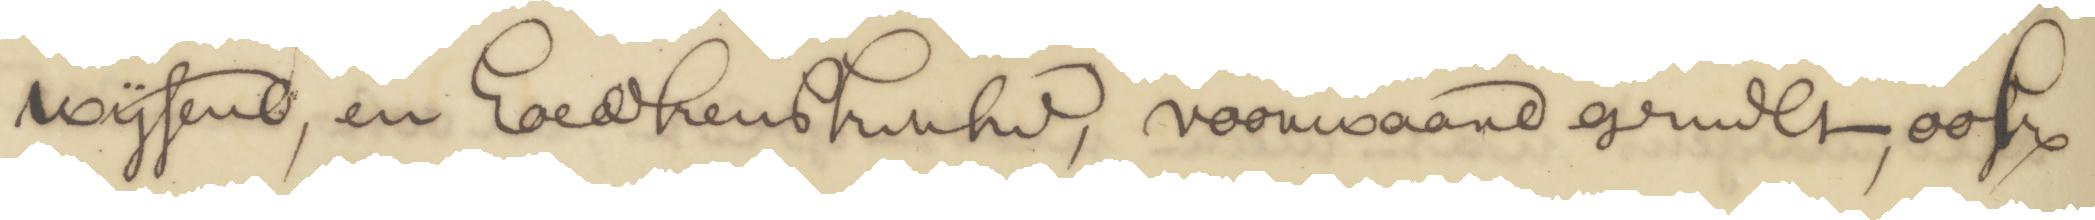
wijsend, en hoedekenskerke, voorwaard gemelt, ook
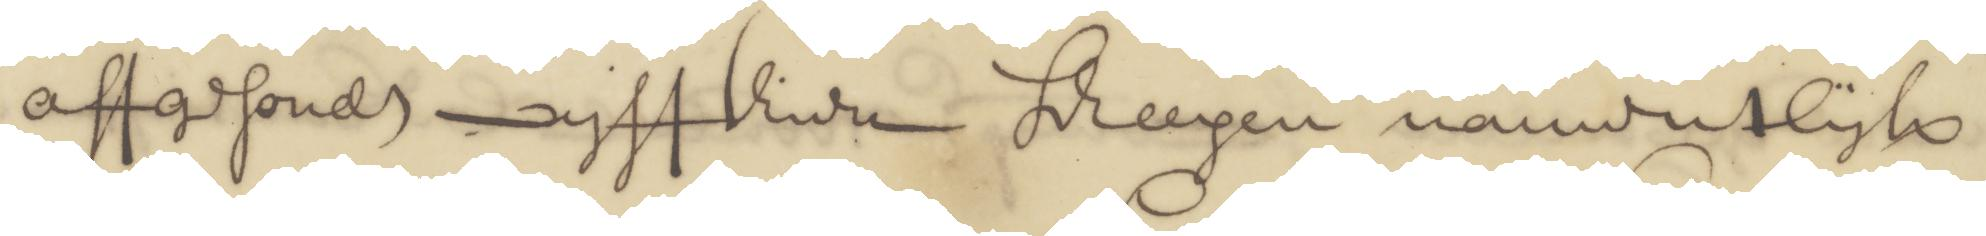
affgesonden vijffthien scheepen namentlijk
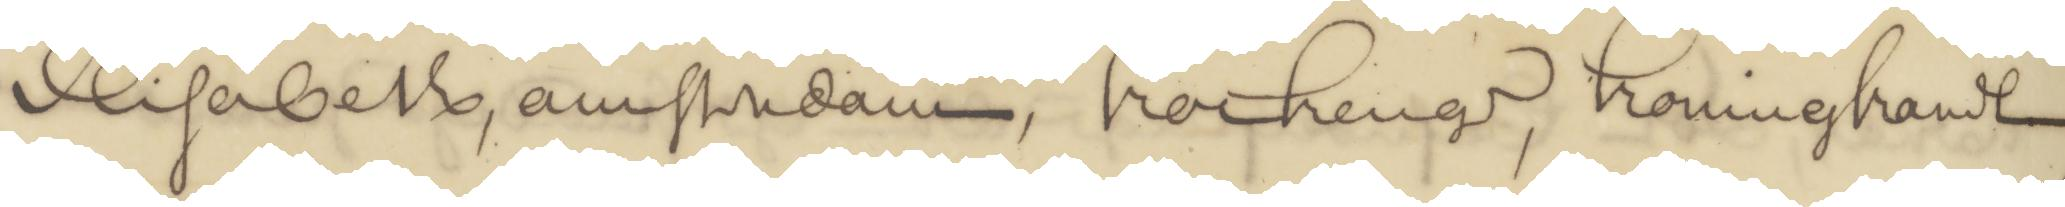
Elisabeth, amsterdam, kockenge, Koning karel
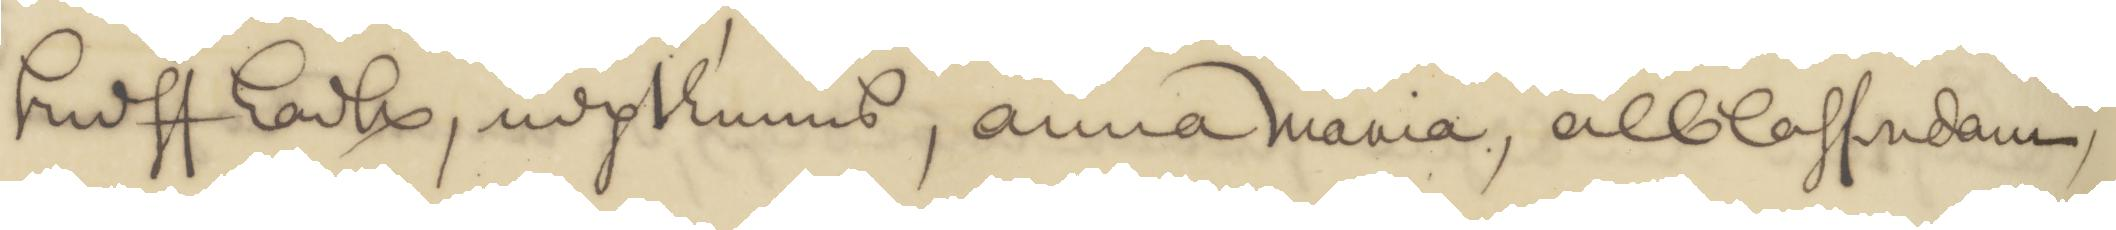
kieffhoek, nepthunus, anna maria, alblasserdam,
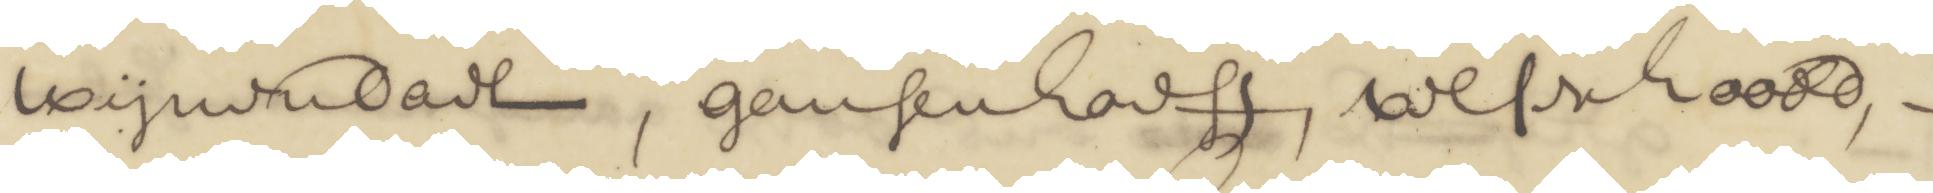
wijnendael, gansenhoeff, velserhoofd,
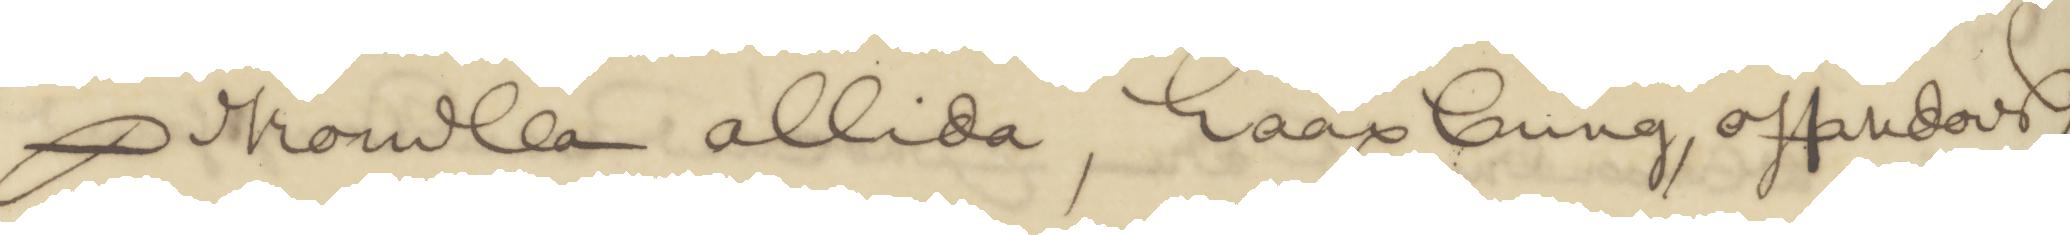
Petronella allida, haaxburg, opperdoes
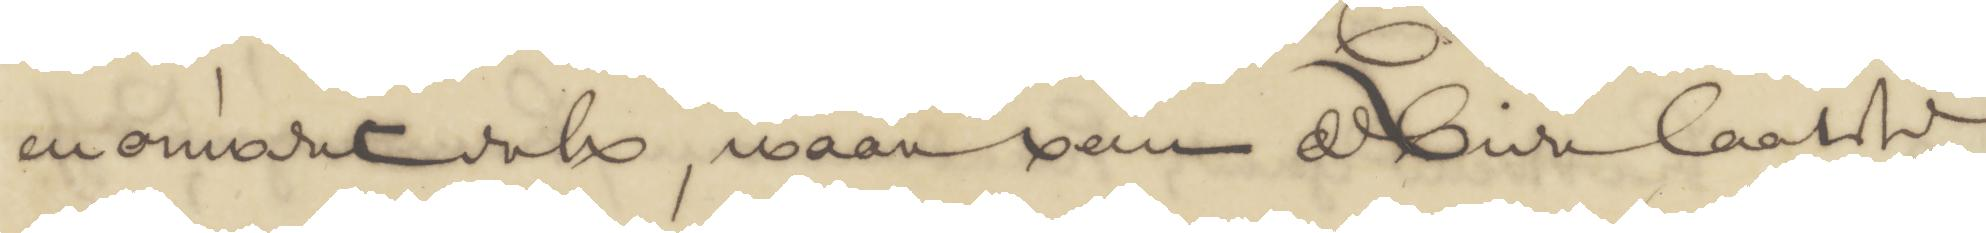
en ouwercerk, waar van de vier laatste
